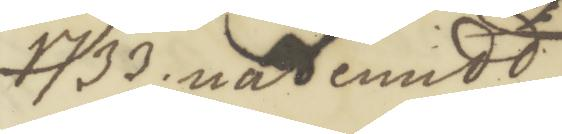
1733. na de midd
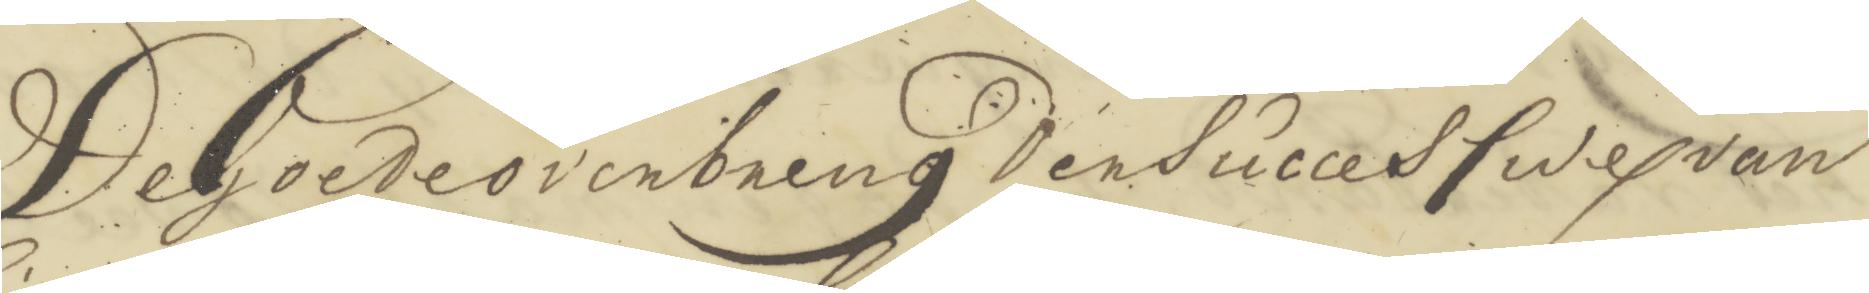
De Goede overbreng der Successive van
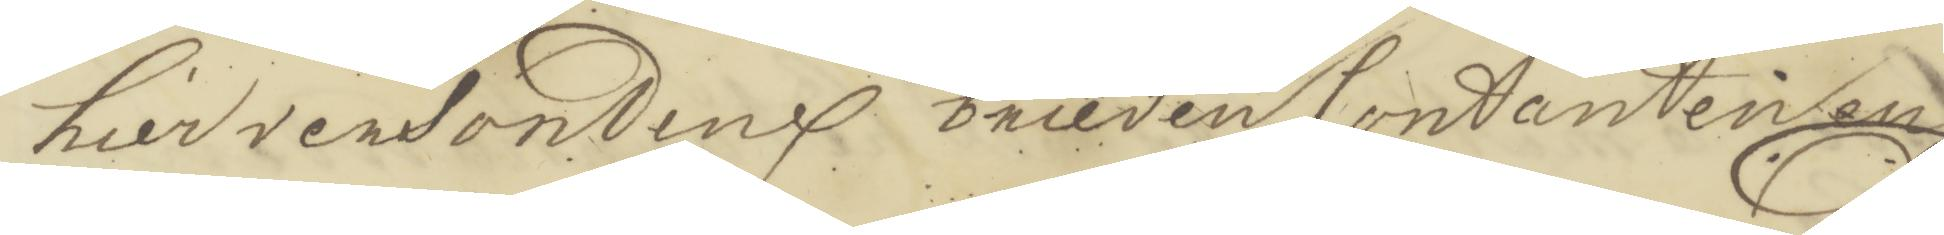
hier versondene brieven Contanten en
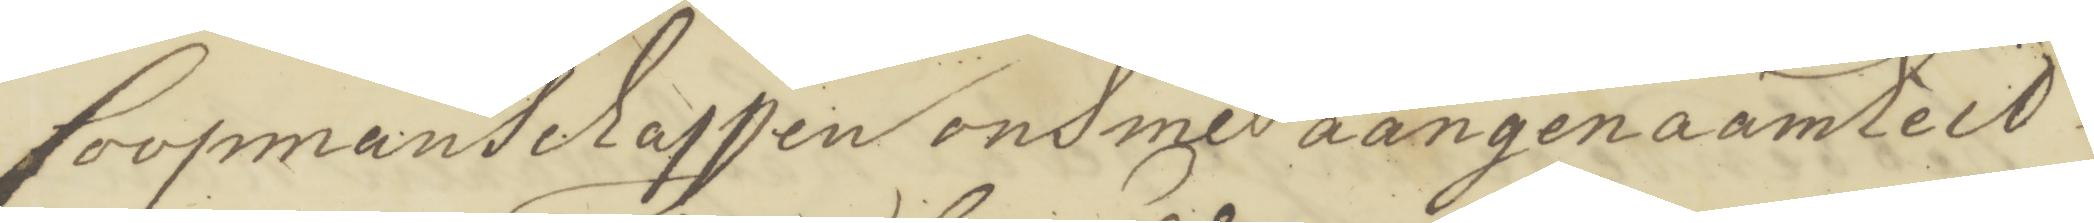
Coopmanschappen ons met aangenaamheid
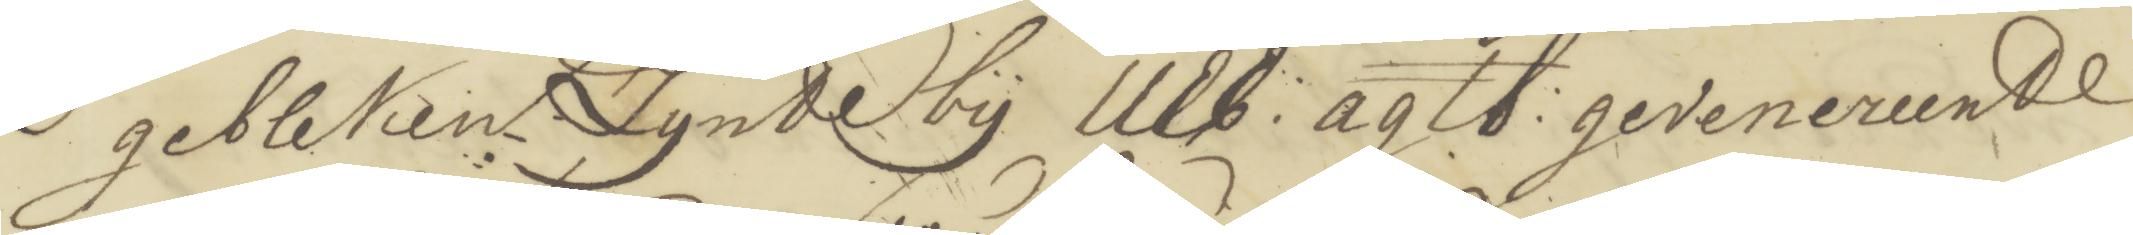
gebleken Zijnde bij UEE: agtb: gevenereerde
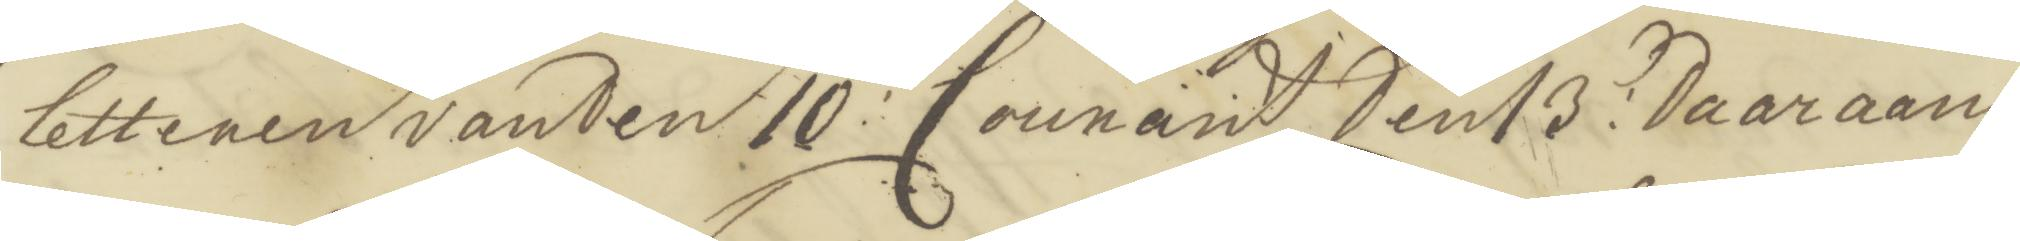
letteren van den 10:' Courant den 13:' daar aan
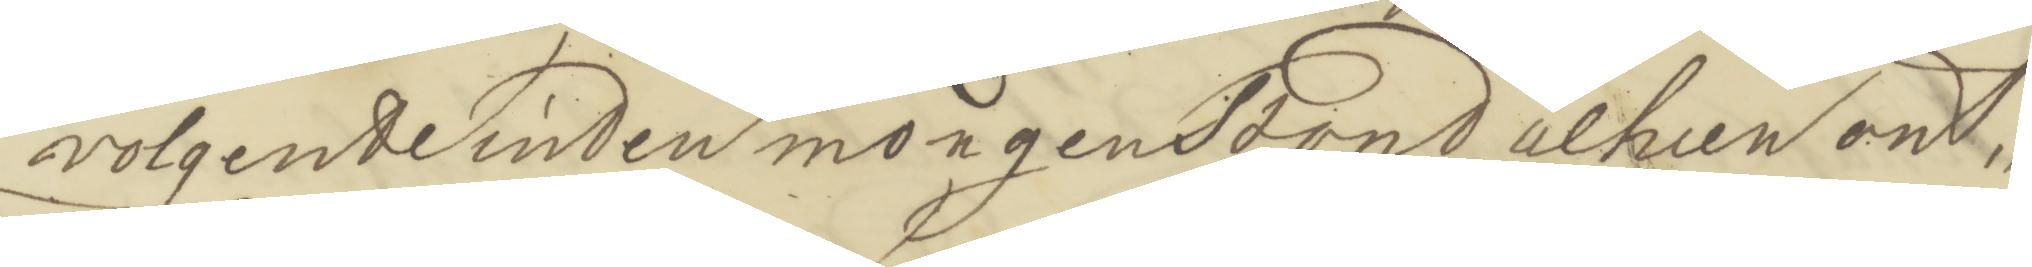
volgende inden morgenstond alhier ont„
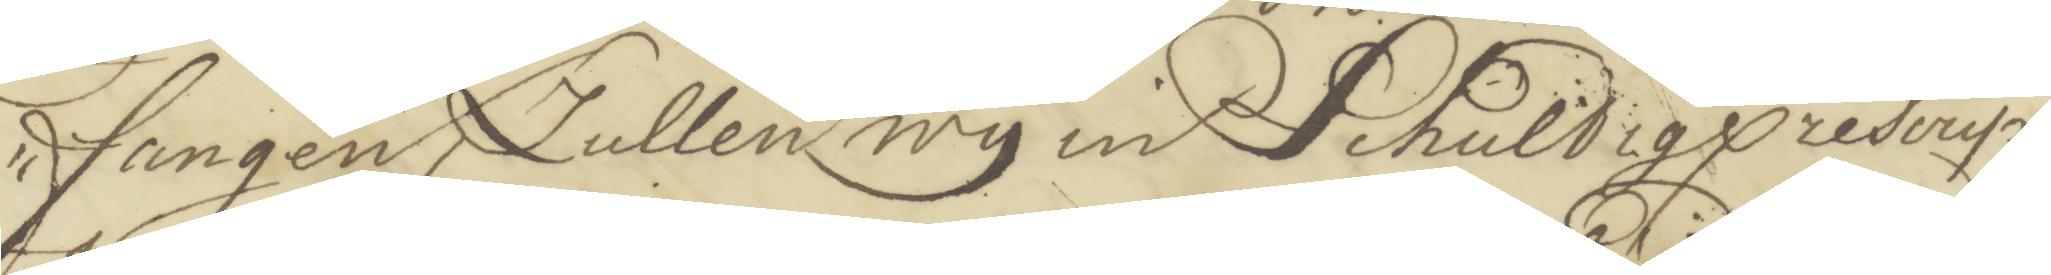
„fangen, Zullen wij in Schuldige reschrip„
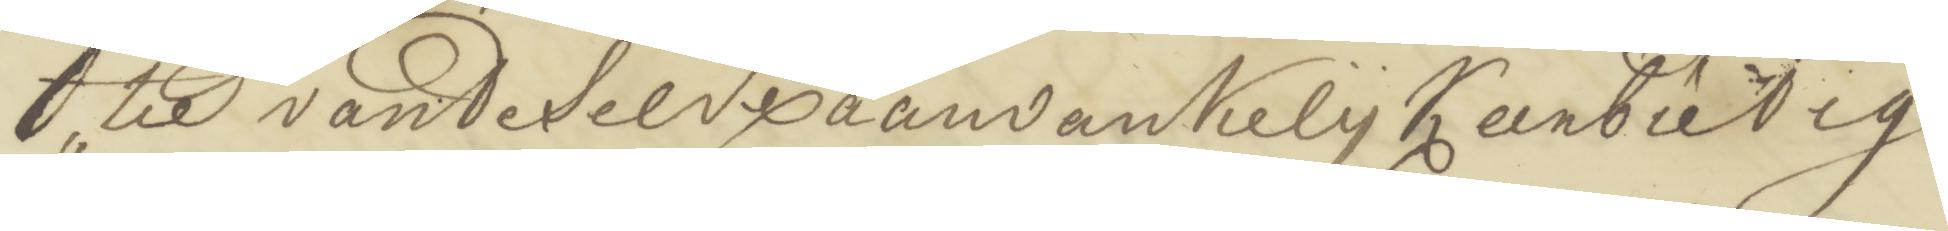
tie van deselve aanvankelijk eerbiedig
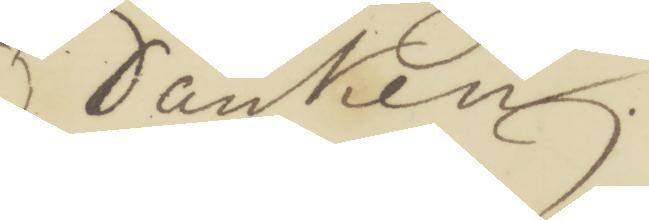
danken.
